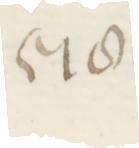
518
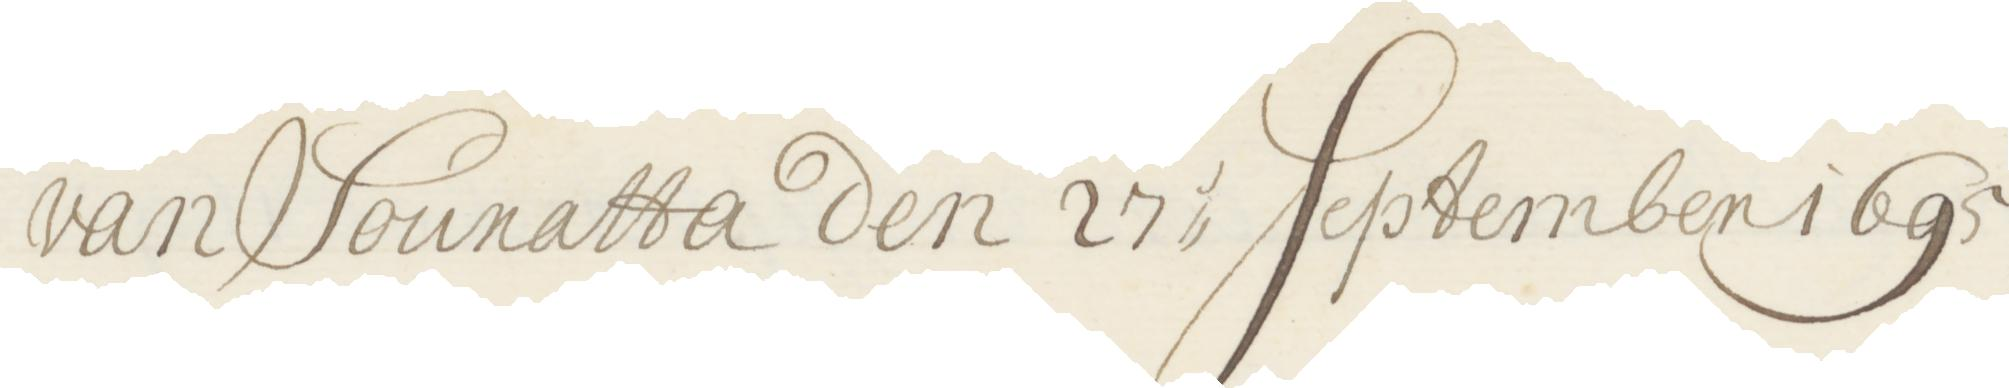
van Souratta den 27„e September 1695
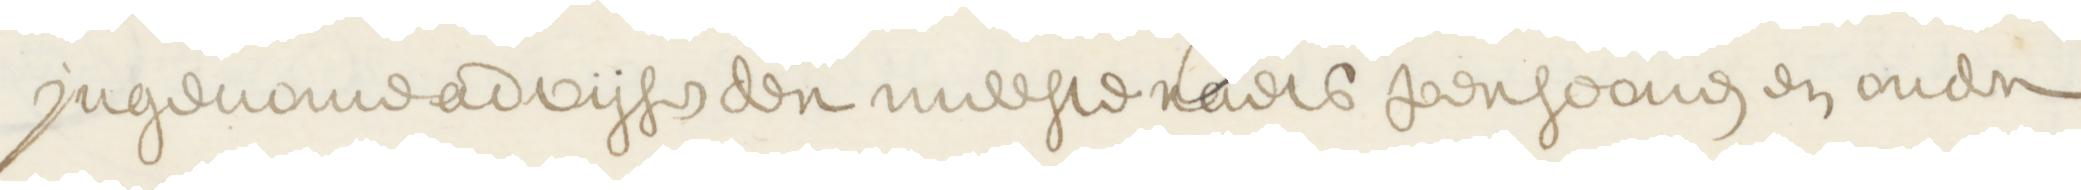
jngenome advijsen den meeste raets persoonen en onder
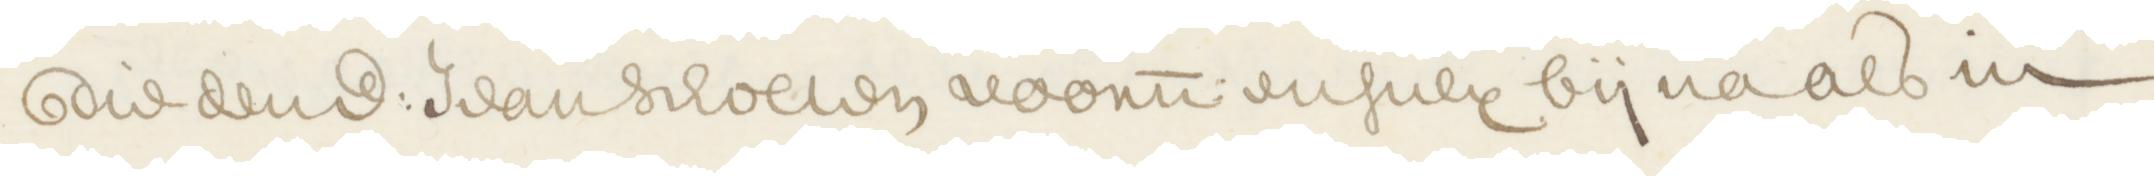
die den E: Iean scholten voorn: ensulx bij na als in
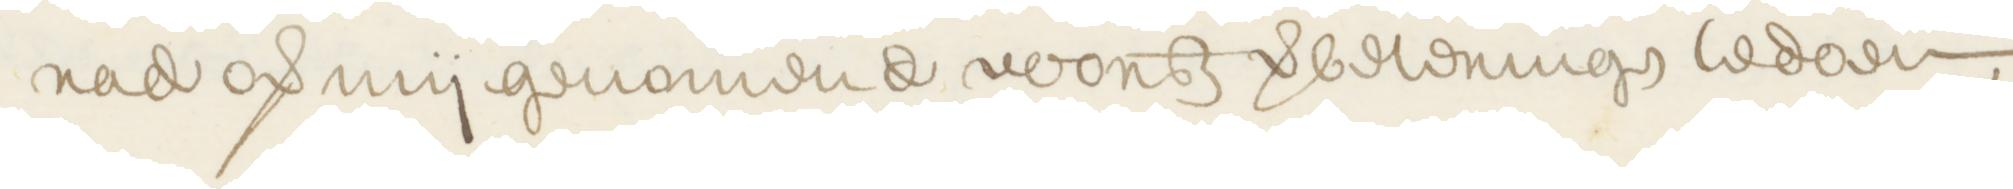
rade over mij genomen de voorsz verbeteringen tedoen,
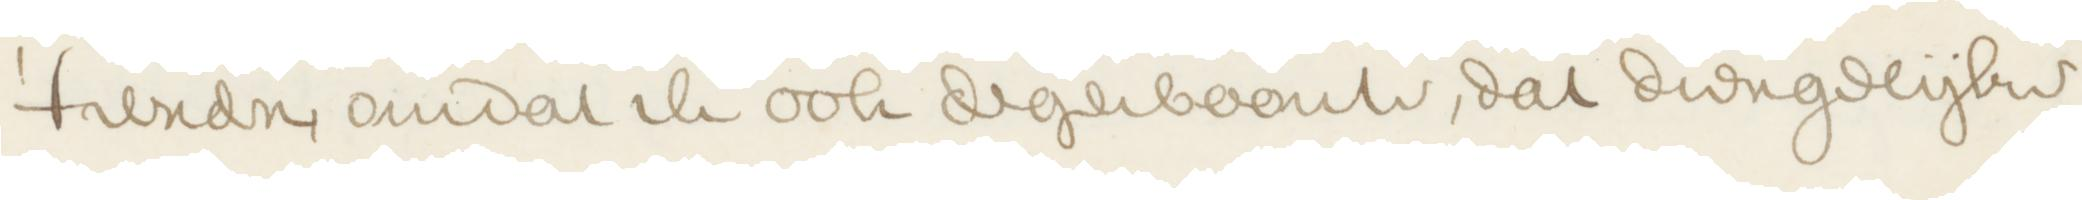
'teerder, omdat ik ook degewoonte, dat diergelijke
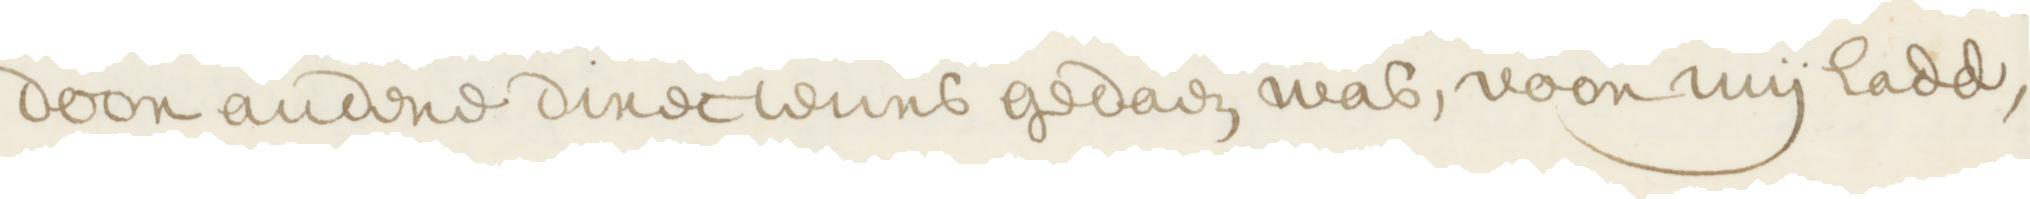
door andere directeurs gedaen was, voor mij hadde,
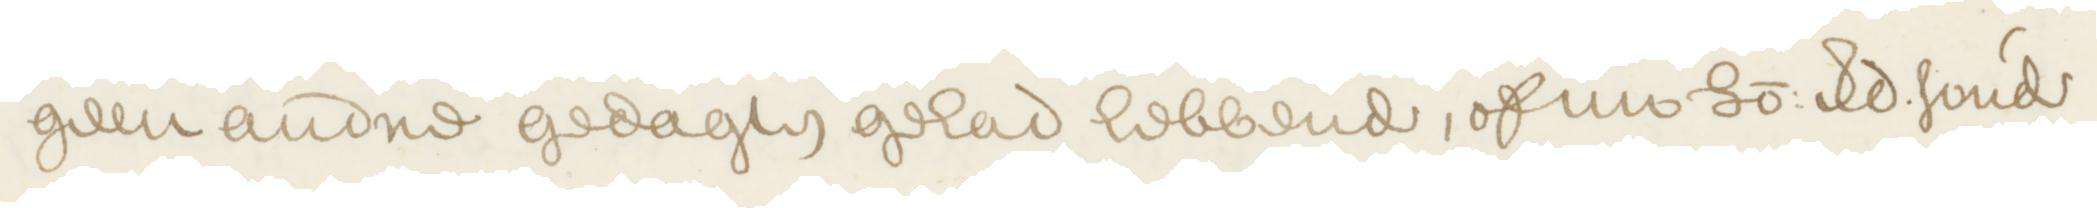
geen andre gedagten gehad hebbende, ofuw ho: Ed. soude
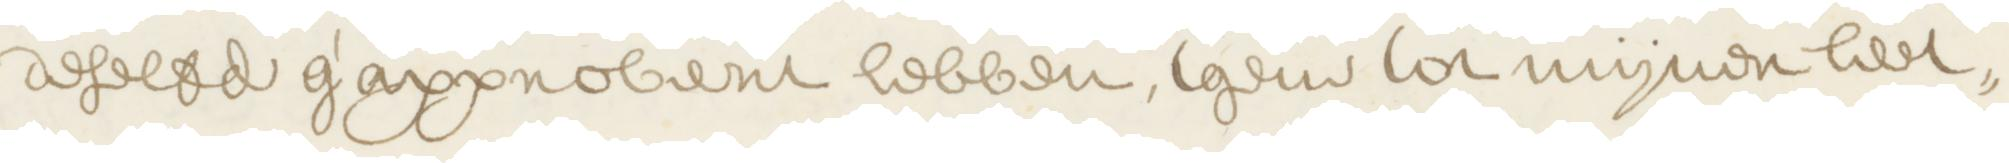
deselfde g'approbeert hebben, 'tgene tot mijner leet„
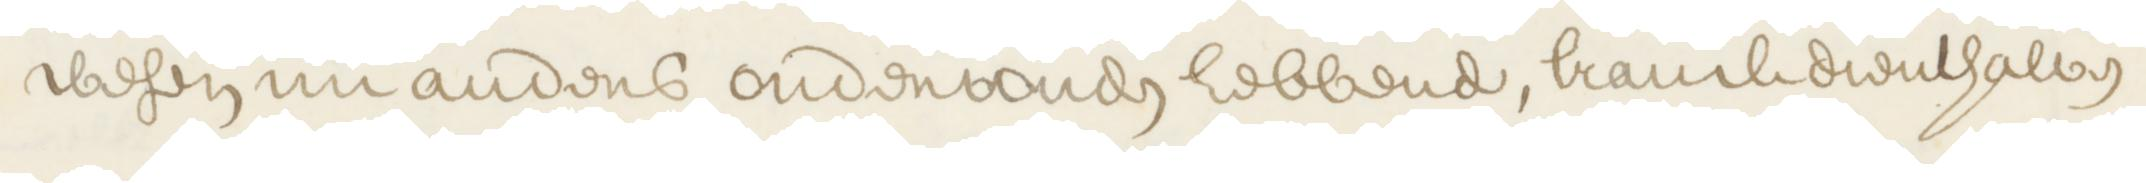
wesen nu anders ondervonden hebbende, kanik dienthalven
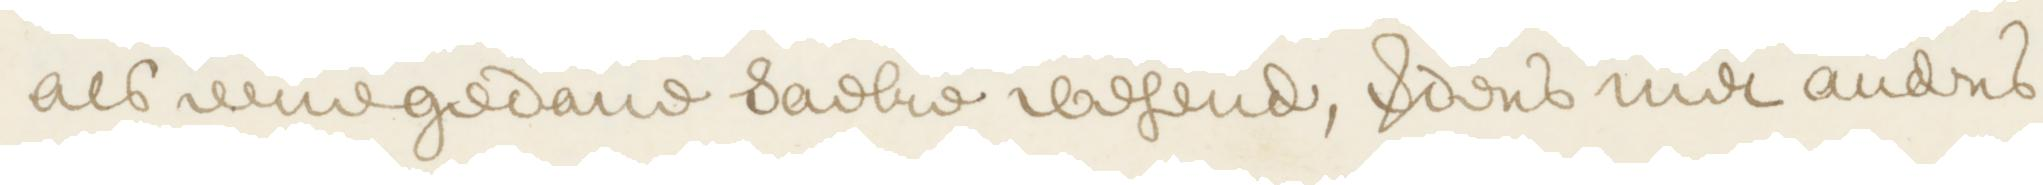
als eene gedane saeke wesende, verders niet anders
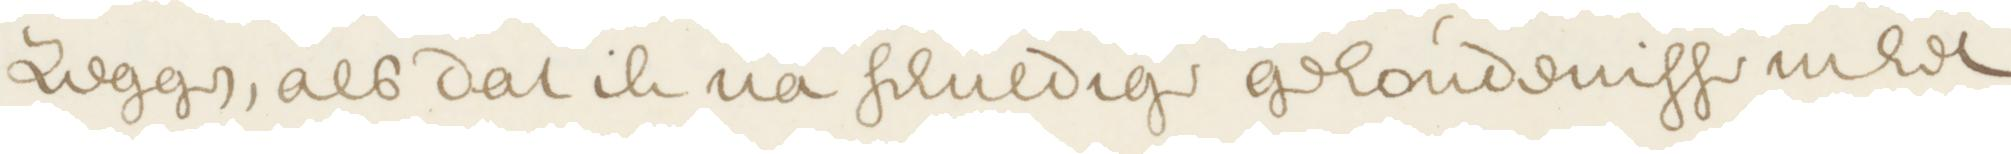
zeggen, als dat ik na schuldige gehoudenisse inhet
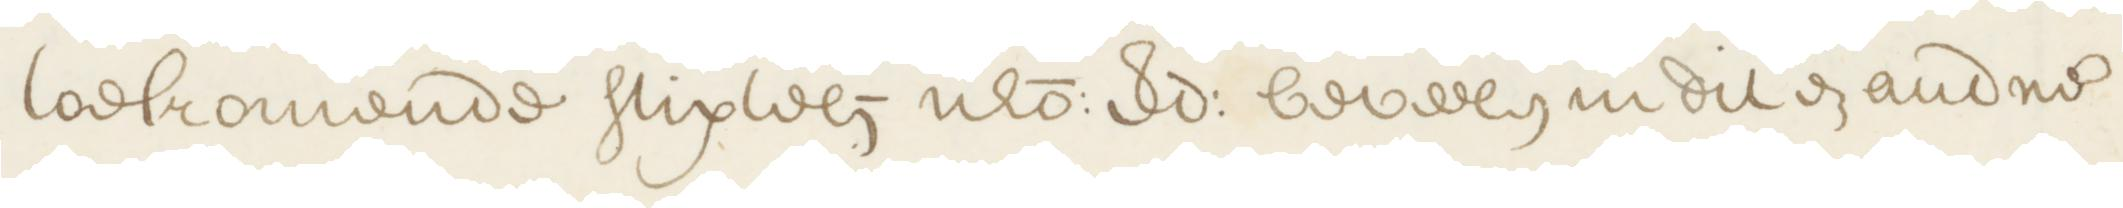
toekomende stiptelijk uho: Ed: beveelen in dit en andre
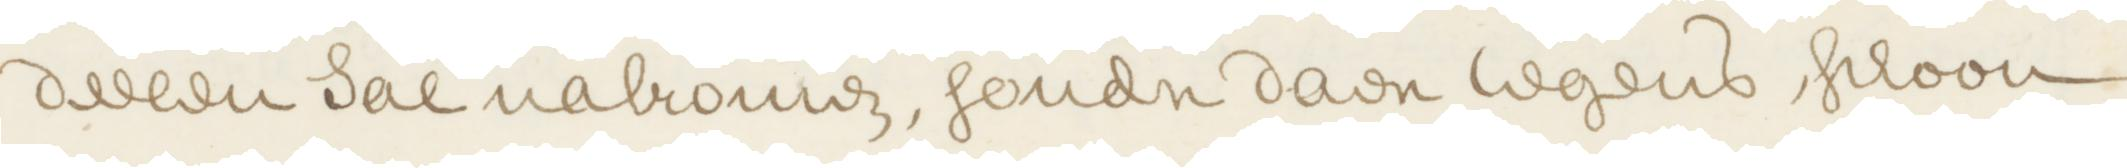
deelen sal nakomen, sonder daer tegens, schoon
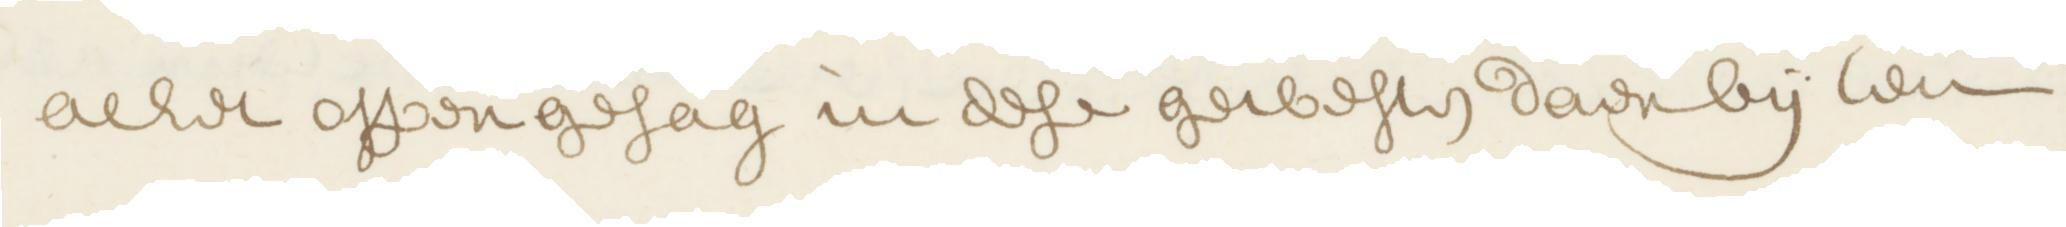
alhet opper gesag in dese gewesten daer bij ten
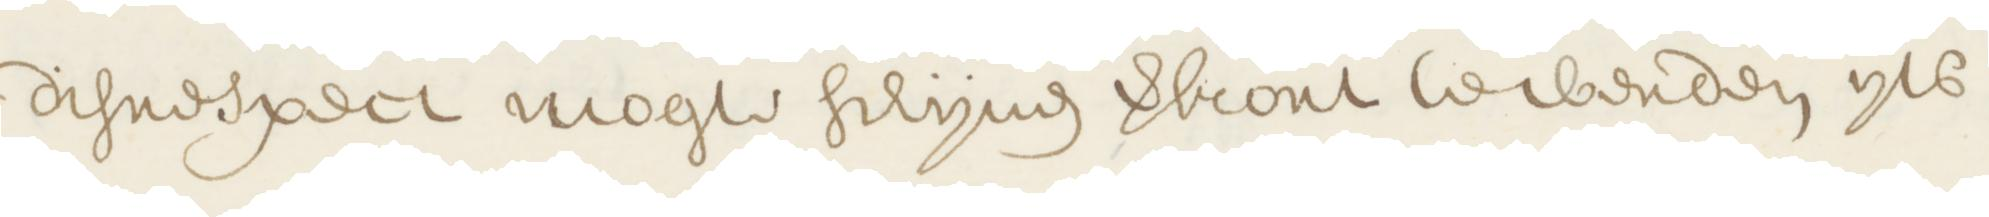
disrespect mogte schijnen verkort tewerden ijts
